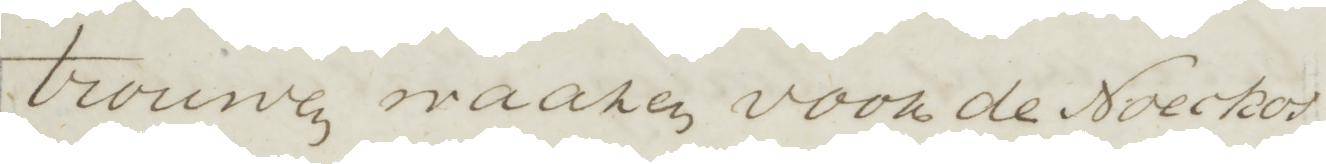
trouwen waaren voor de Noeckos
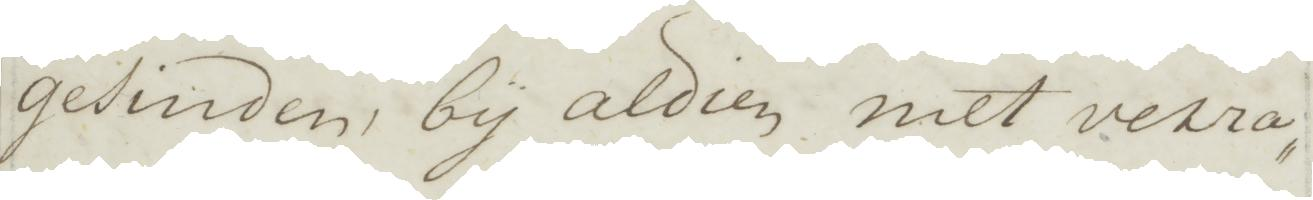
gesinden, bij aldien niet verra„
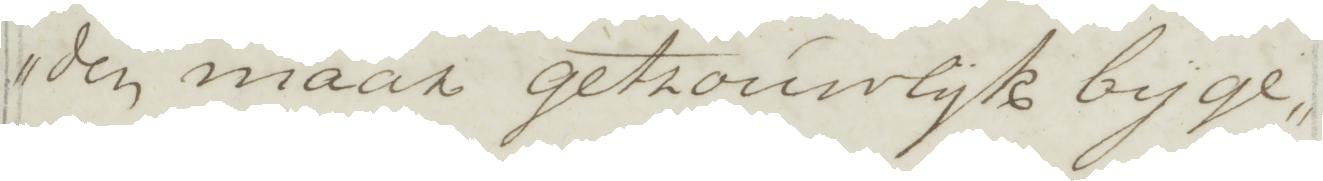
„den maar getrouwlijk bij ge„
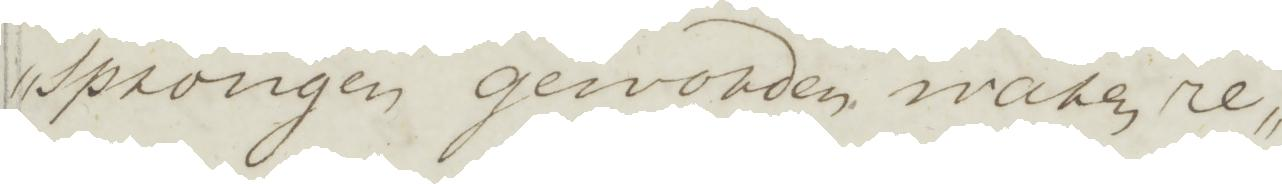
„sprongen geworden waren re„
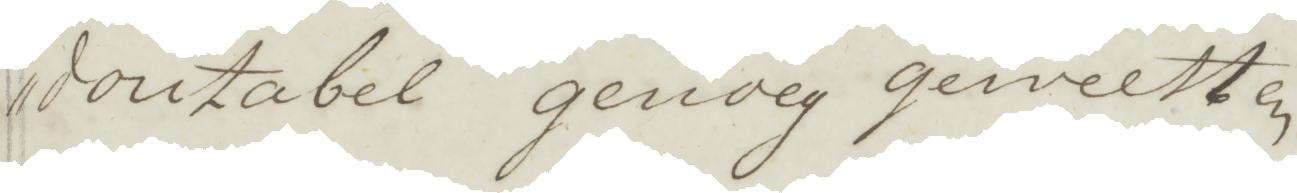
„doutabel genoeg geweest en
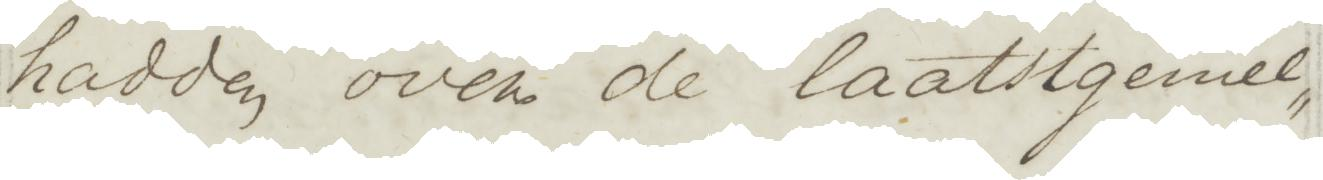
hadden over de laatstgemel„
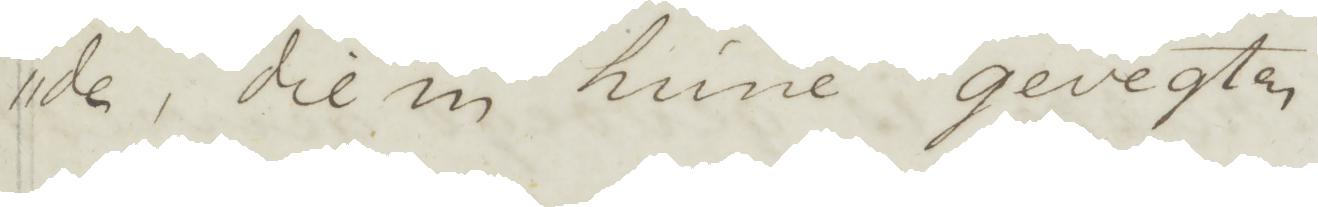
„de, die in hune gevegten
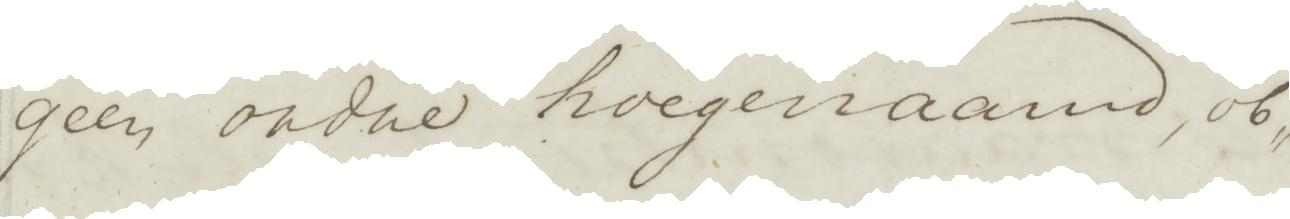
geen ordre hoegenaamd, ob„
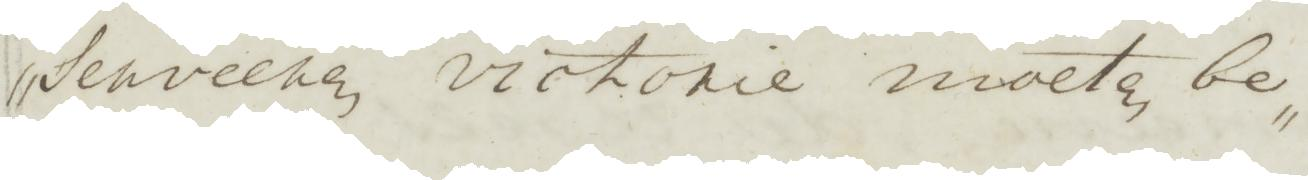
„serveeren victorie moeten be„
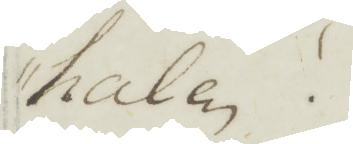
halen!
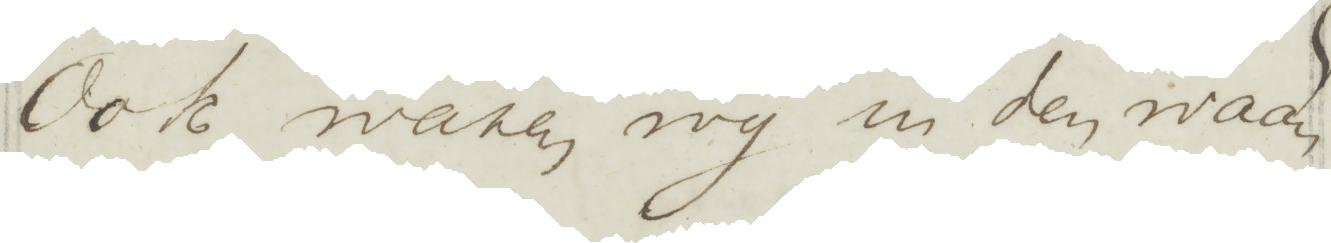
Ook waren wij in den waan,
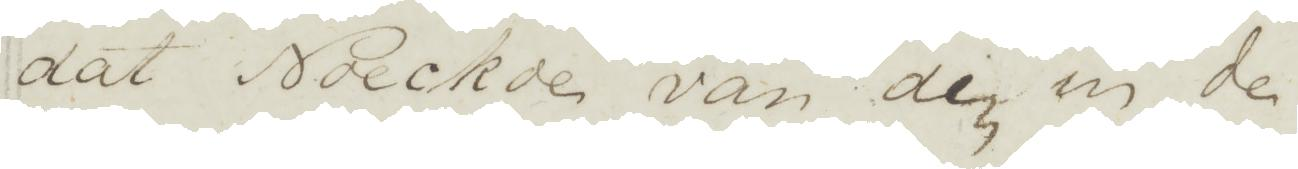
dat Noeckde van den in de
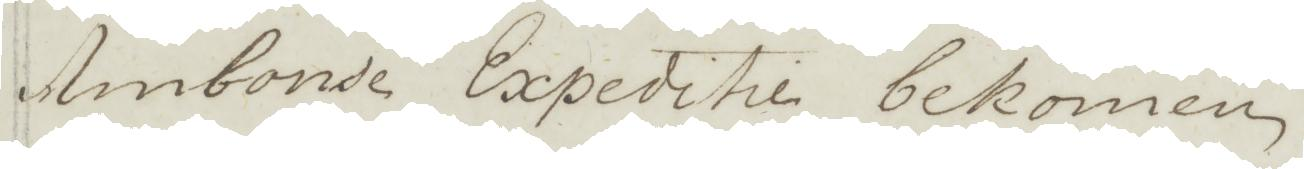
Ambonse Expeditie bekomen
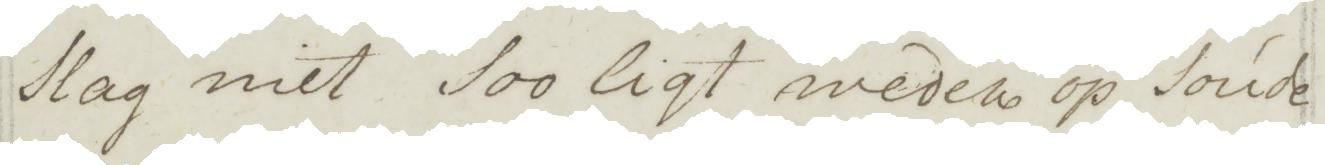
slag niet soo ligt weder op soude
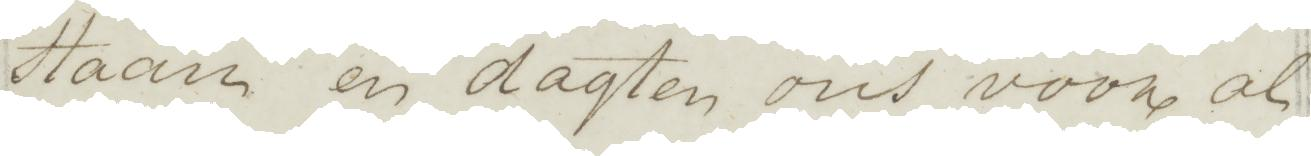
staan en dagten ons voor al
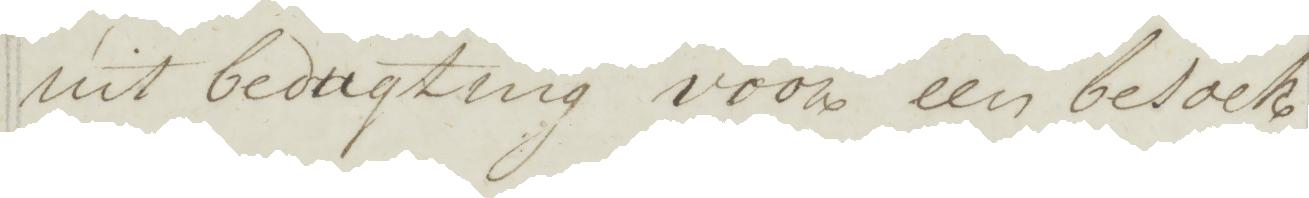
uit bedugting voor een besoek
